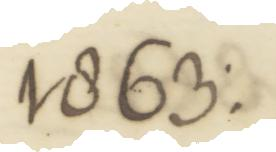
1863:
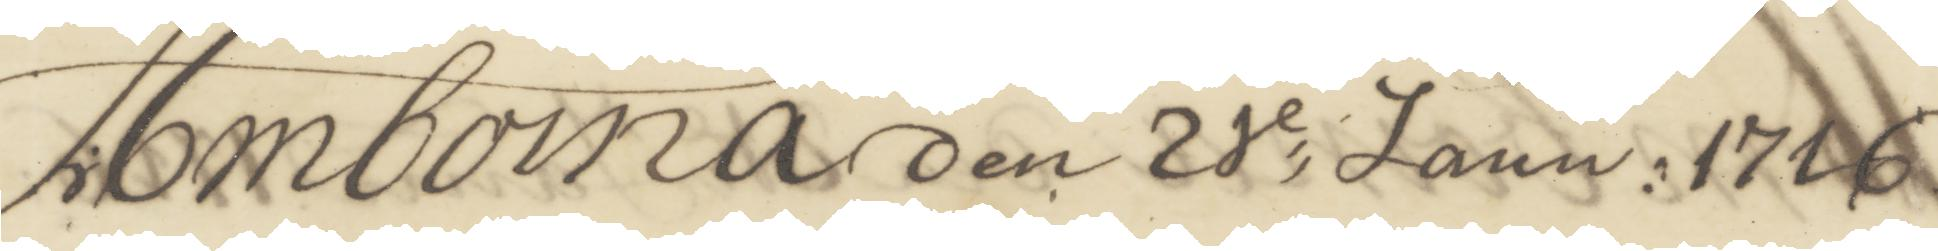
Amboina den 21e Ianu: 1716:
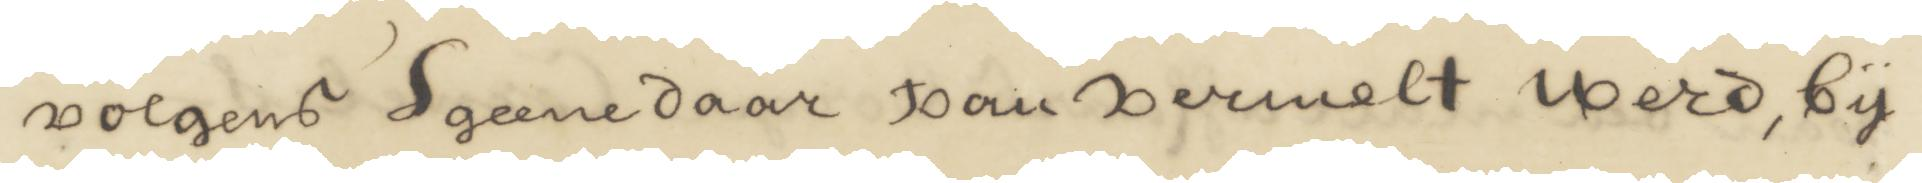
volgens ’t geene daar van vermelt werd, bij
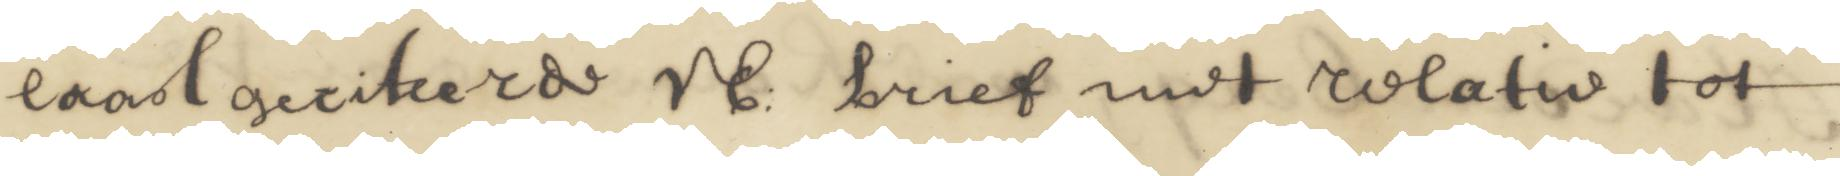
laast geciteerde UE: brief met relatie tot
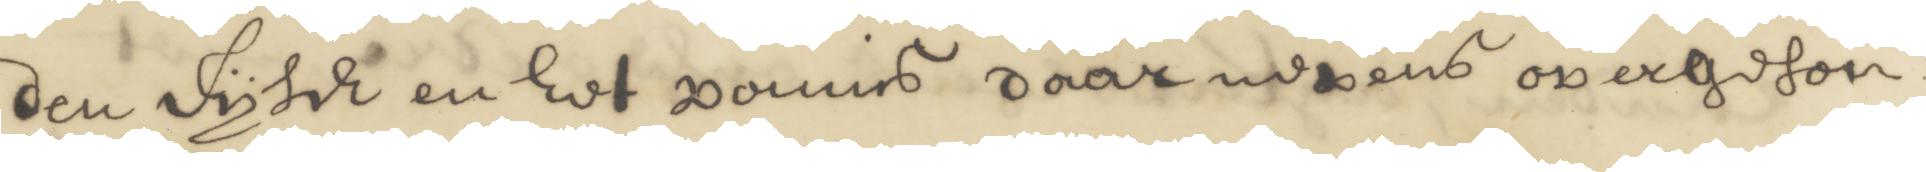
den Eijsch en het vonnis daar nevens overgeson
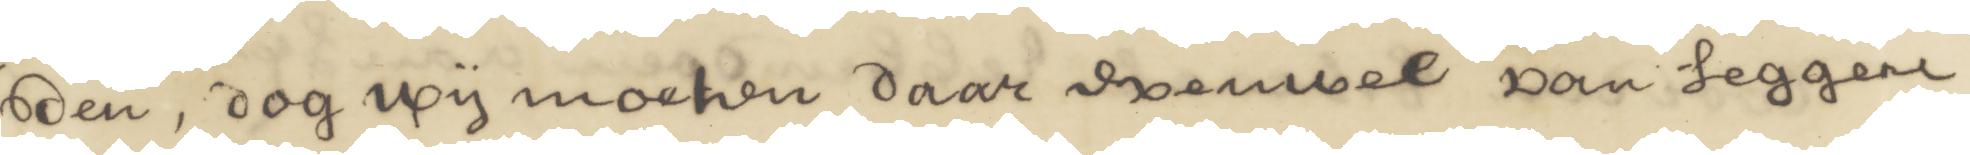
den, dog wij moeten daar evenwel van seggen
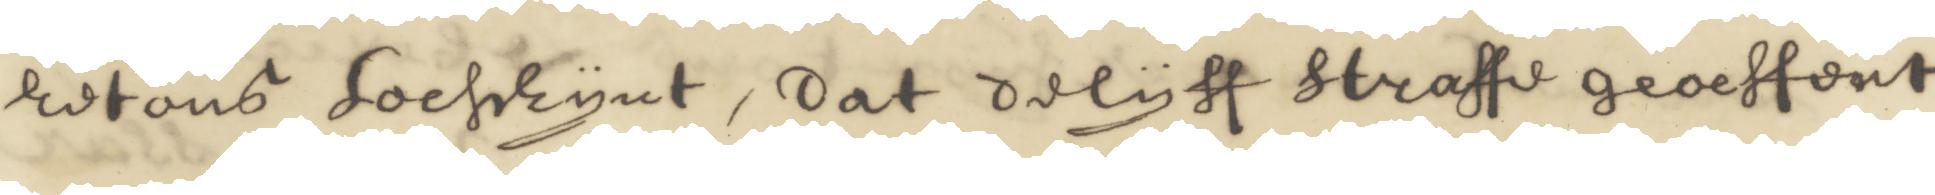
het ons toeschijnt, dat delijff straffe geoeffent
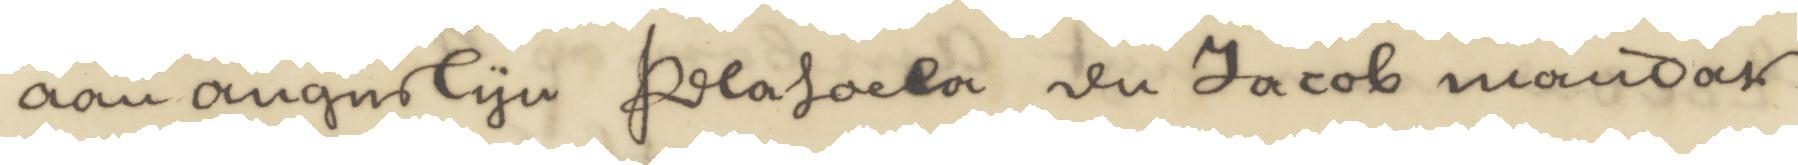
aan augustijn Pelasoela en Iacob mandar
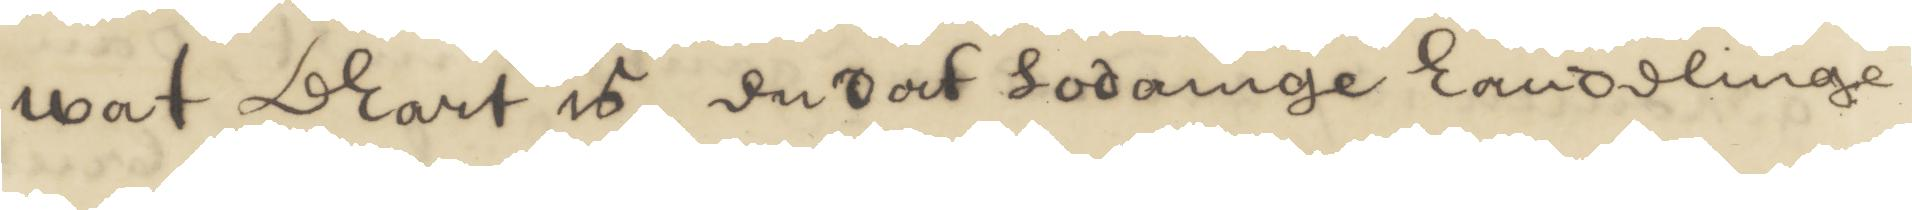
wat tehart is en dat sodanige handelinge
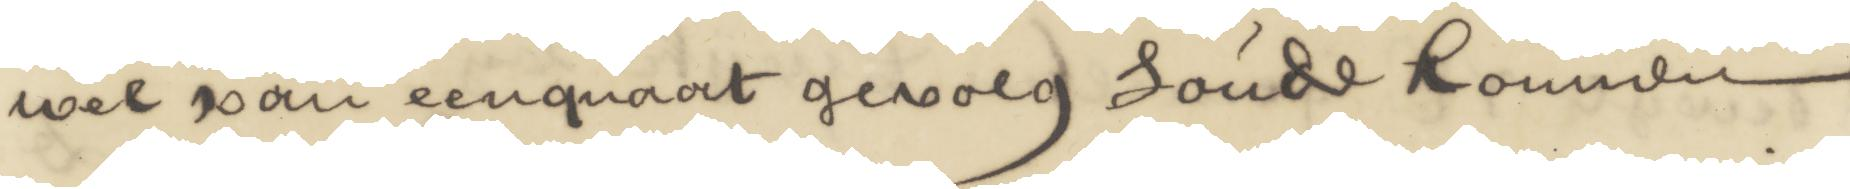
wel van eenquaat gevolg soude konnen
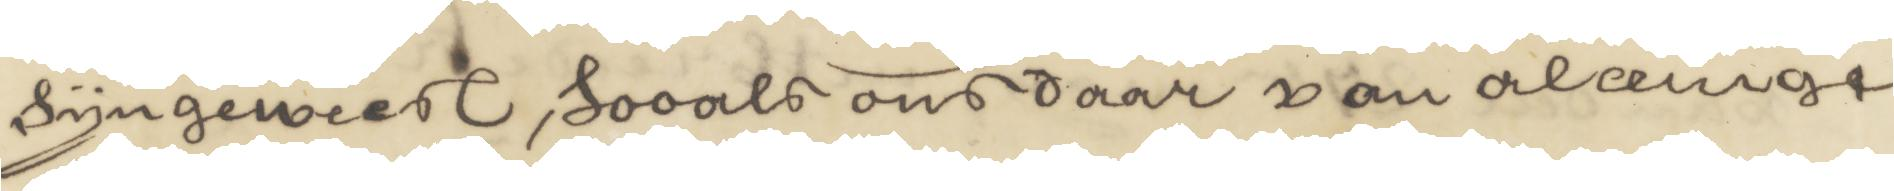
sijn geweest, sooals ons daar van al eenige
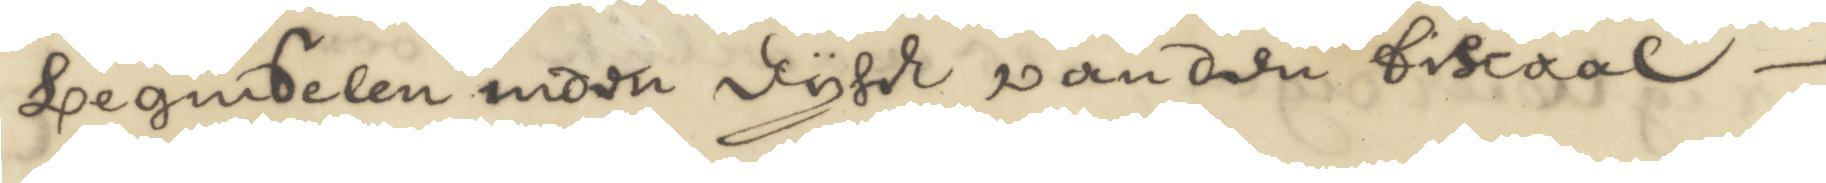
beginselen inden Eijsch van den fiscaal -
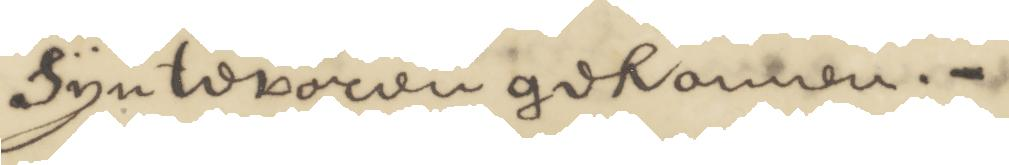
sijn tevoren gekomen. -
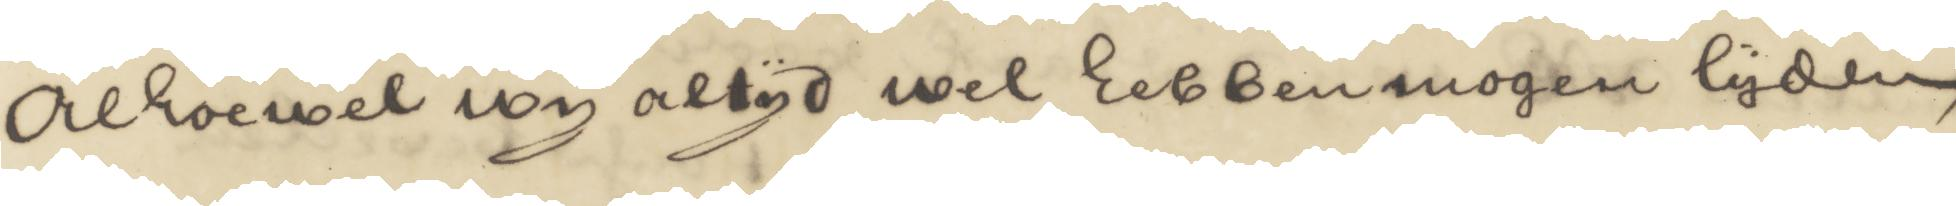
Alhoewel wij altijd wel hebben mogen lijden,
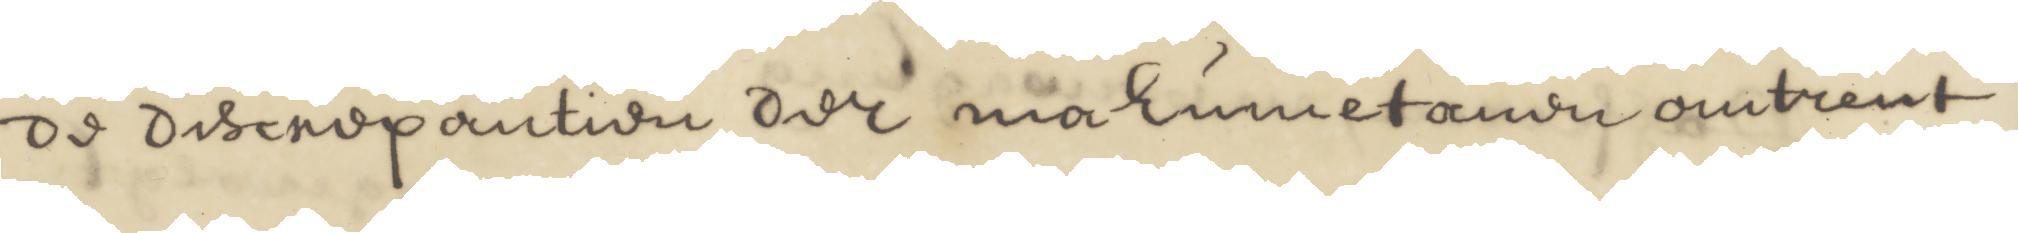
de discrepantien der mahumetanen omtrent
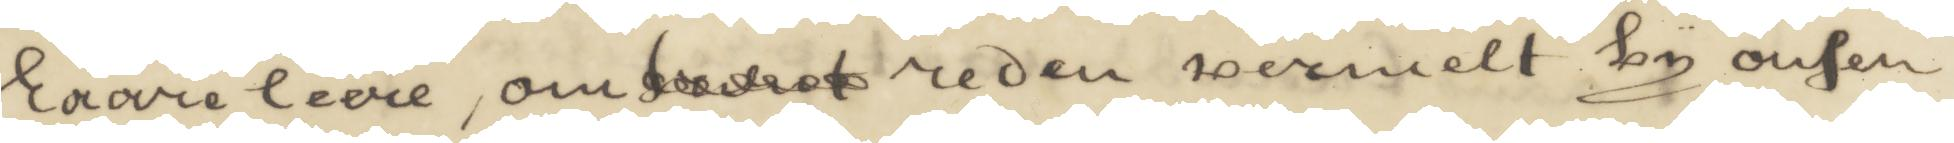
haare leere, om trent reden vermelt bij onsen
